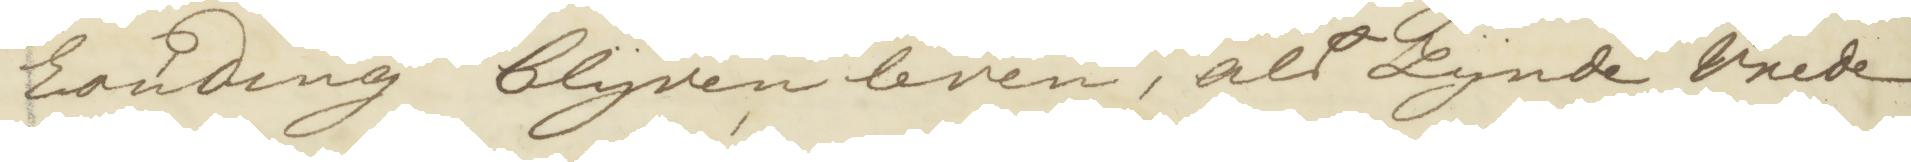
houding blijven leven, als zijnde vrede
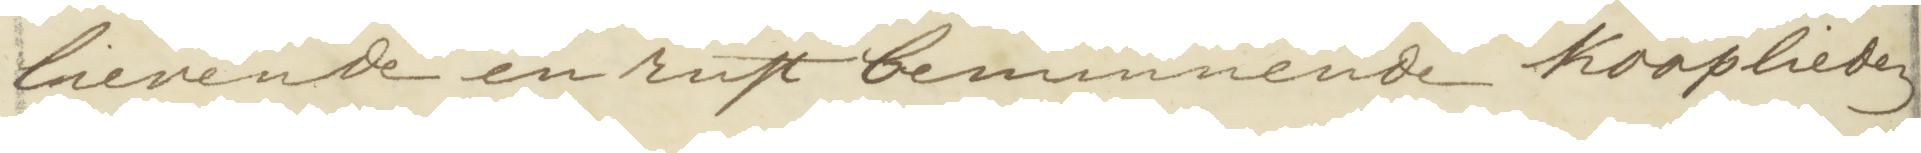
lievende en rust beminnende Kooplieden
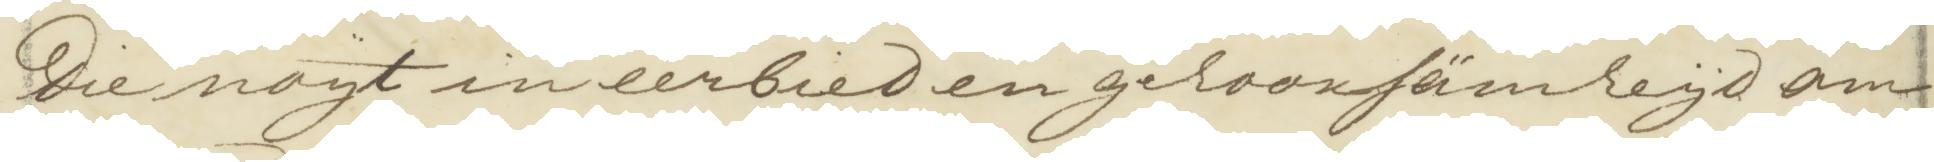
die noijt in eerbied en gehoorsämheijd om
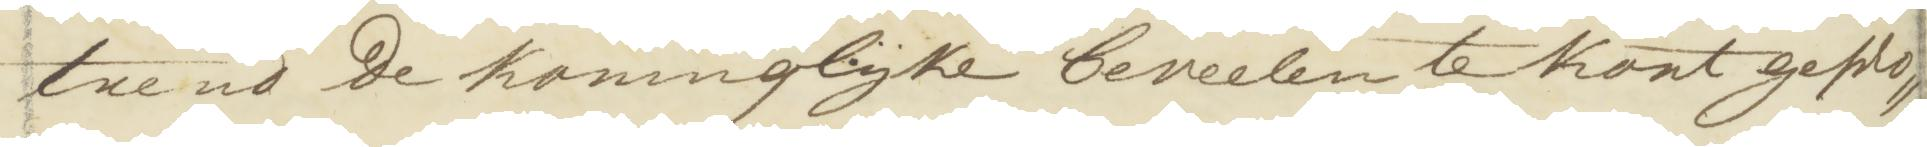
trend de Koninglijke beveelen te kort geplo„
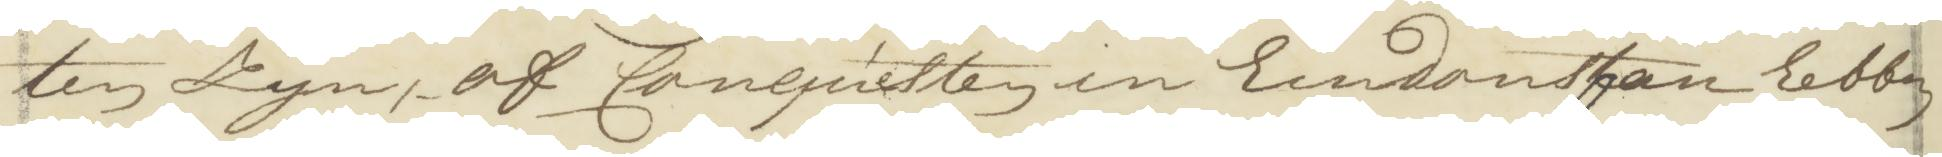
ten zijn, of Conquesten in hindoustan hebben
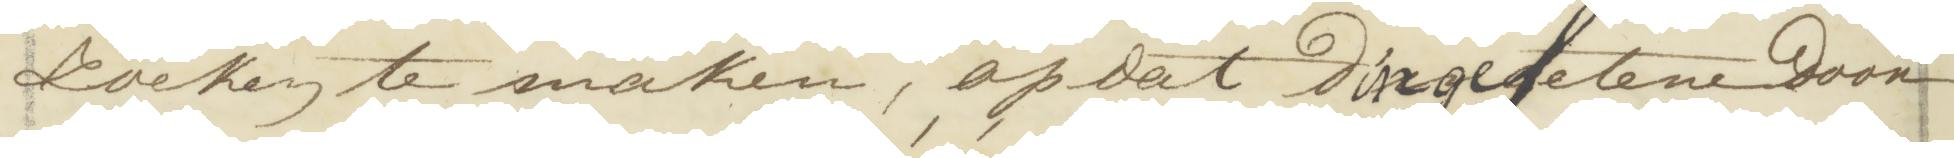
zoeken te maken, op dat d'ingesetene door
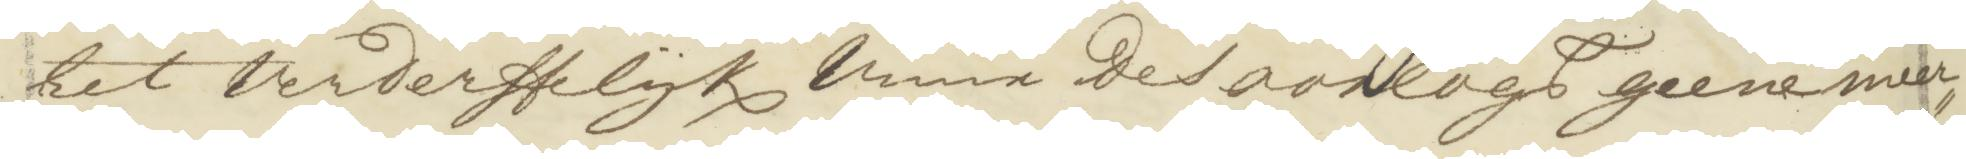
het verderffelijk vuur des oorlogs geene meer„
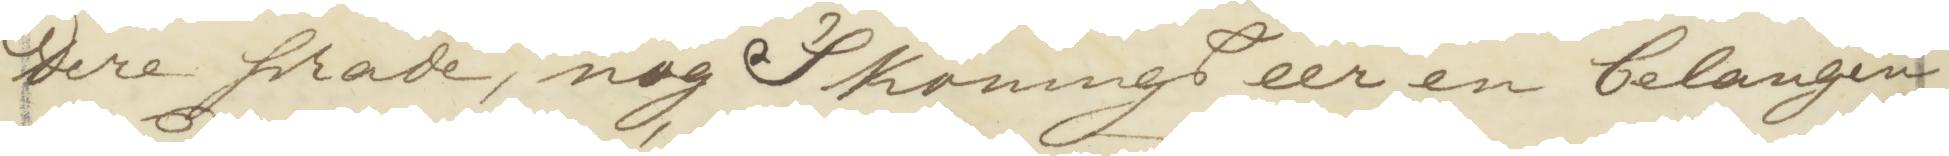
dere schade, nog 'S Konings eer en belangen
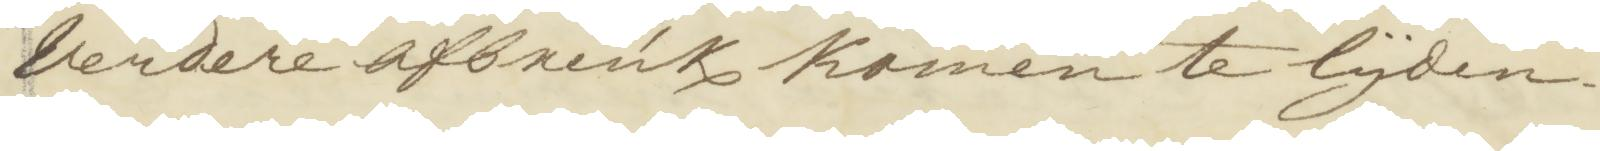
verdere afbreuk komen te lijden.
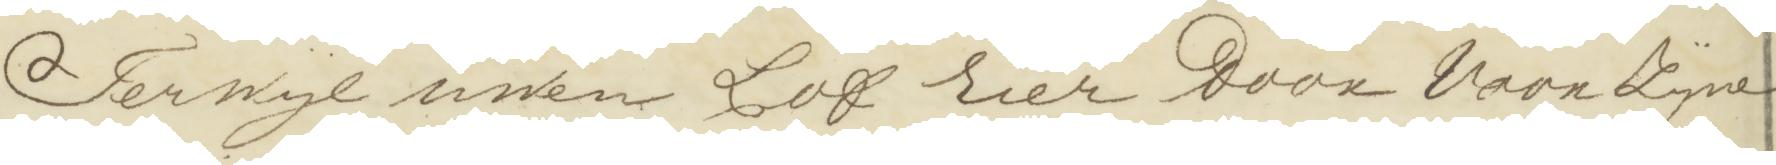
Terwijl uwen Lof hier door voor Zijne
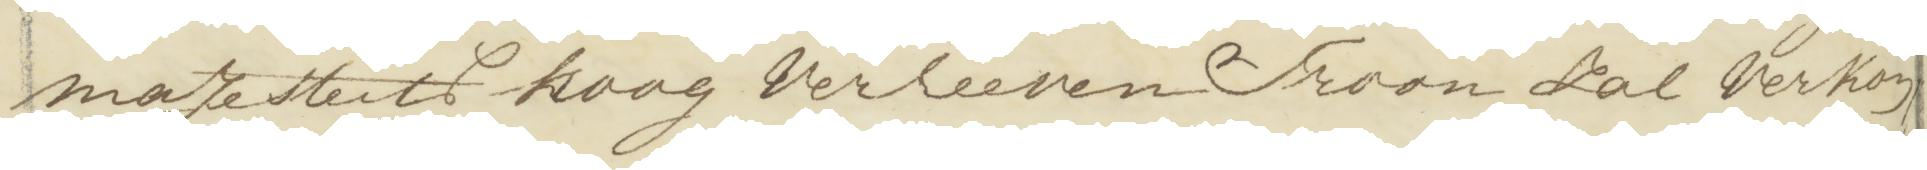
majesteits hoog verheeven Troon zal verkon„
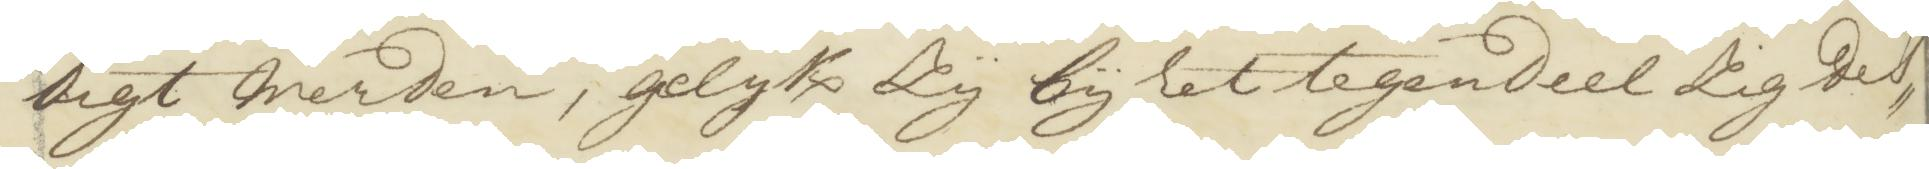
digt werden, gelyk zij bij het tegendeel zig des„
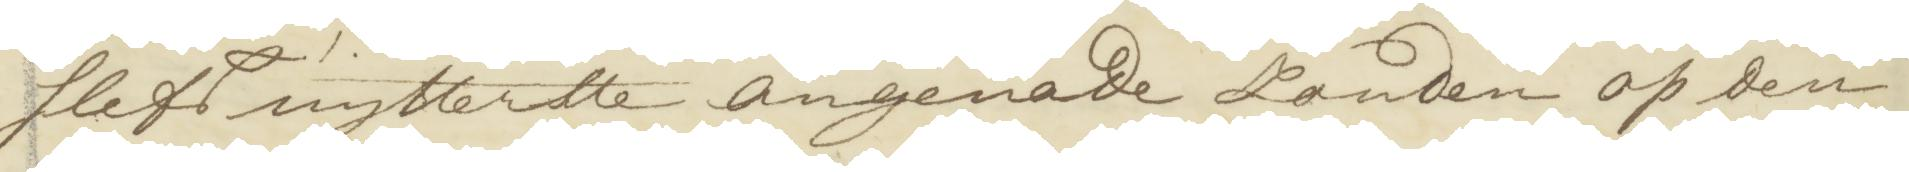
slefs uijtterste ongenade zouden op den
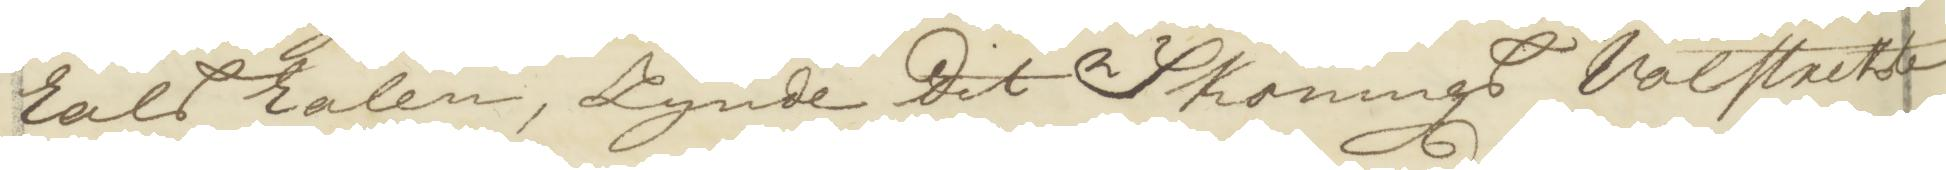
hals halen, zijnde dit 'S Konings volstrekte
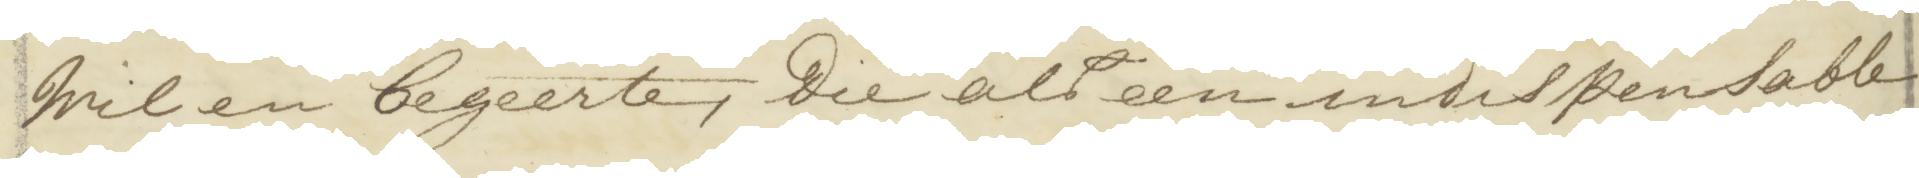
wil en begeerte, die als een indispensable
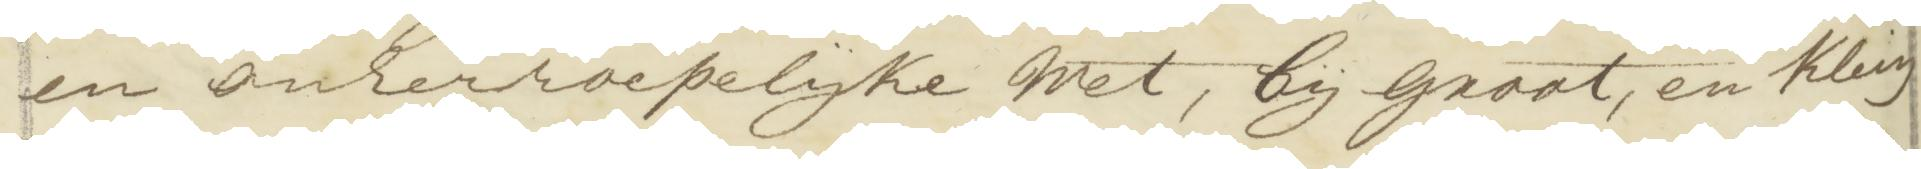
en onherroepelijke wet, bij groot, en klein
